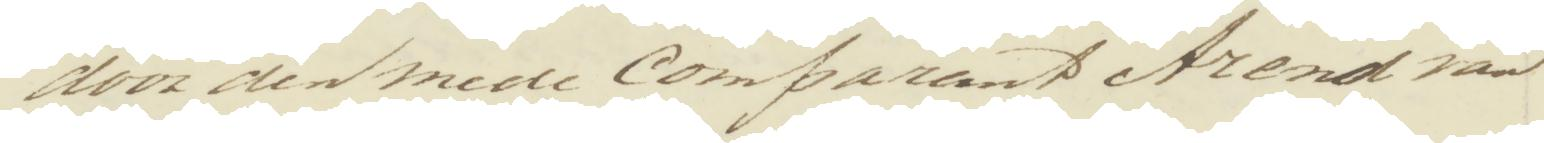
door den mede Comparant Arend van
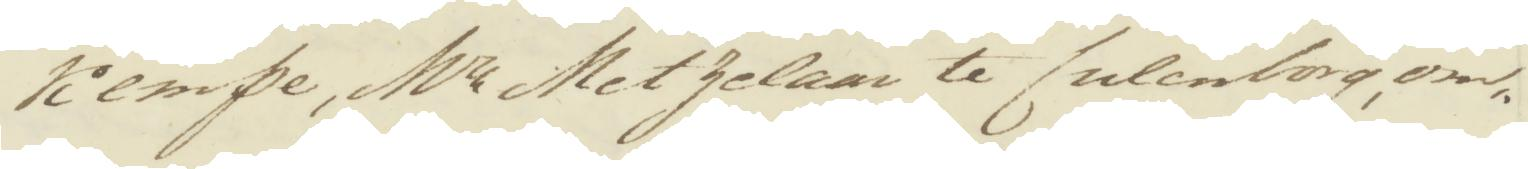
Kempe, M„r Metzelaar te Culenborg, om„
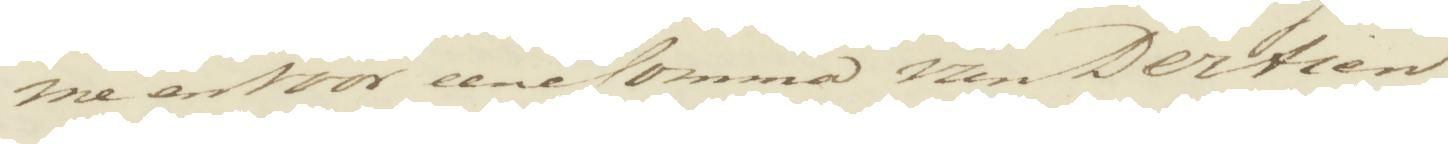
me en voor eene somma van Dertien
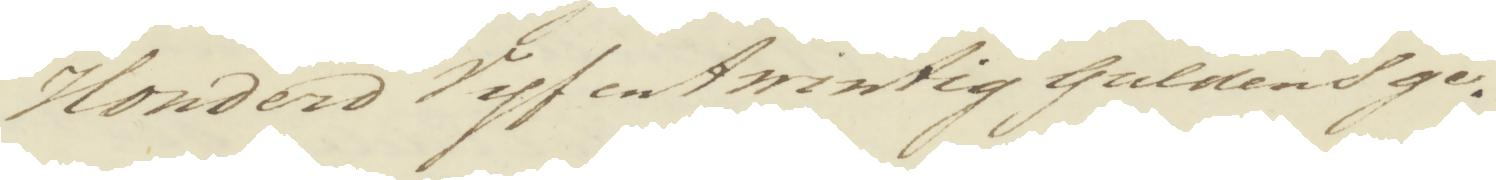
Honderd Vyf en twintig Guldens ge„
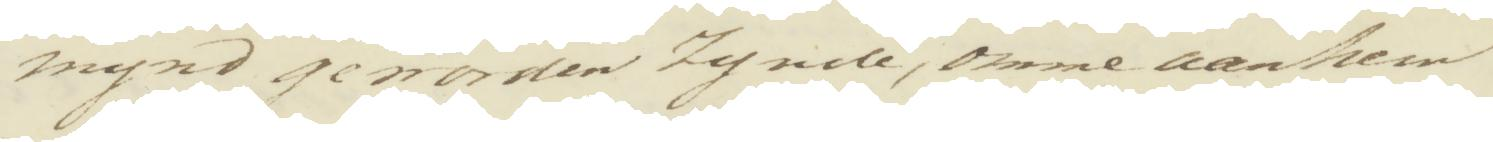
mynd geworden zynde, omme aan hem
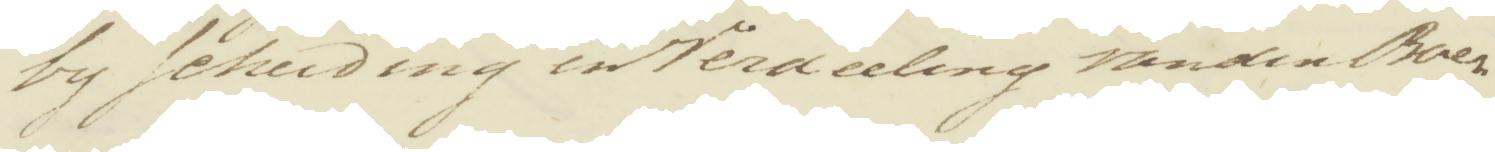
by scheiding en Verdeeling van den Boe
